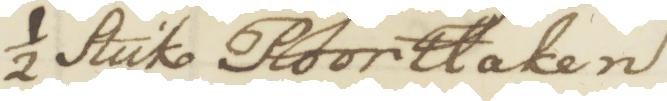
½ stuk Poortlaken
